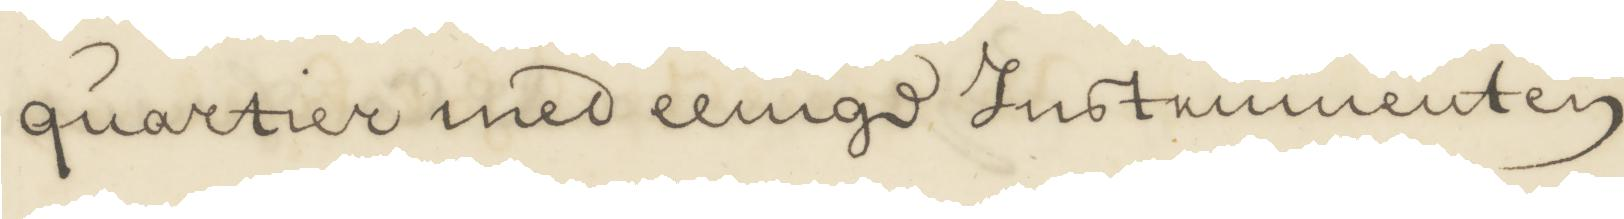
quartier med eenige Instrumenten
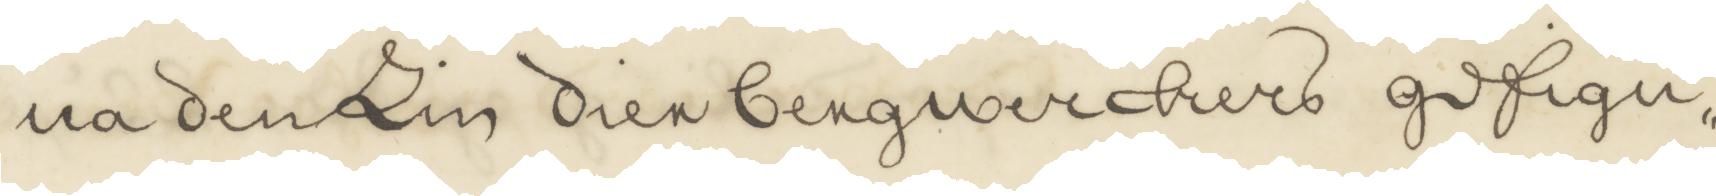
na den Zin dier bergwerckers gefigu„
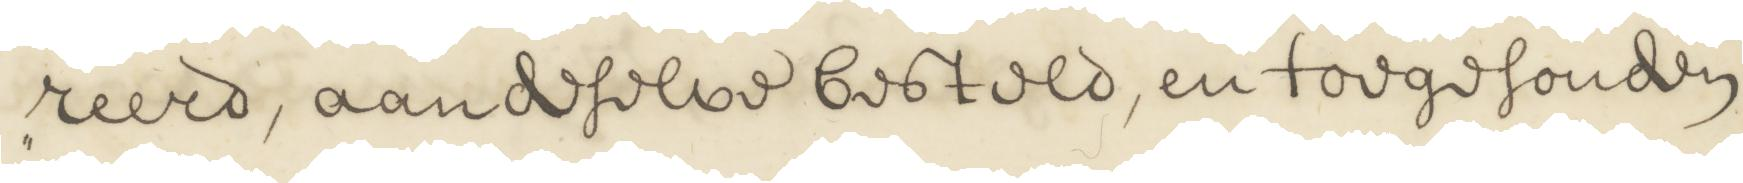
„reerd, aan deselve besteld, en toegesonden
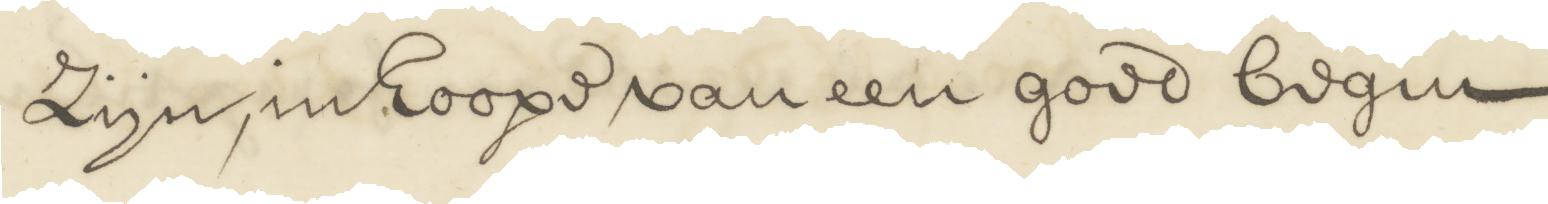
zijn, inhoope van een goed begin.
